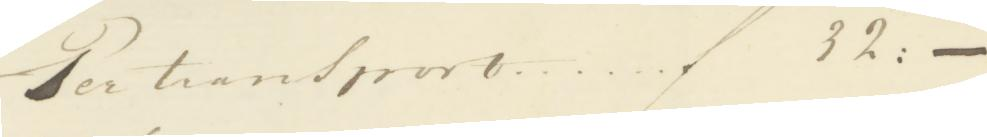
Per transport . . . . . .ƒ 32:—
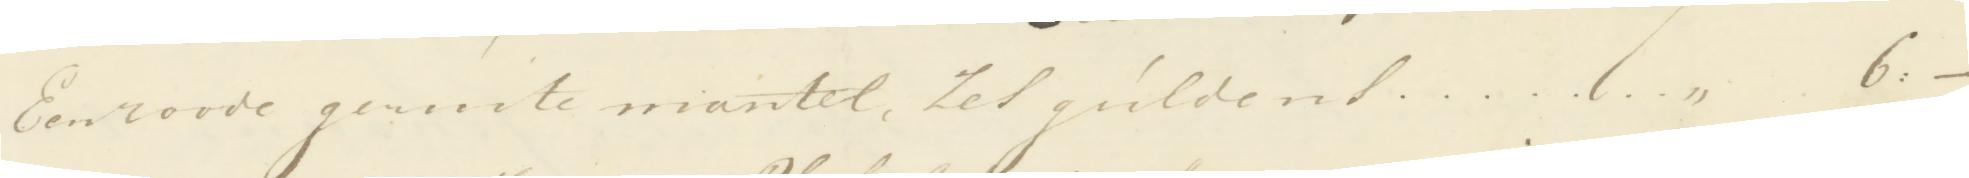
Een roode geruite mantel, Zes guldens. . . . . .. . . „ 6:—
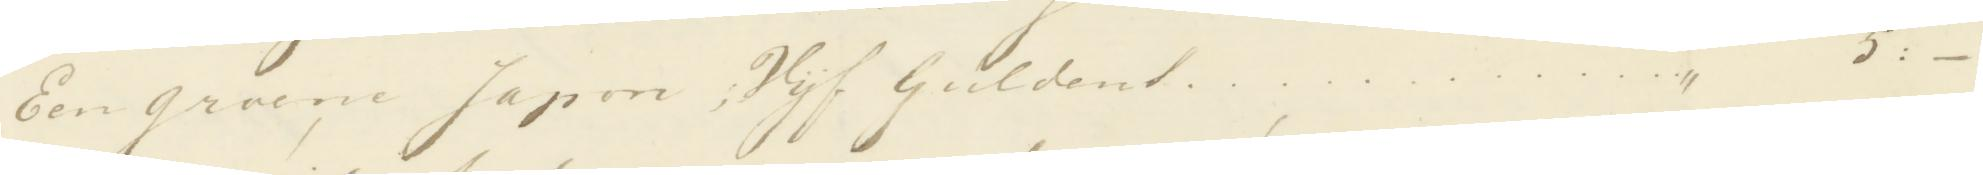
Een groene Japon; Vijf guldens. . . . . . . . . . . . . . . . . „ 5:—
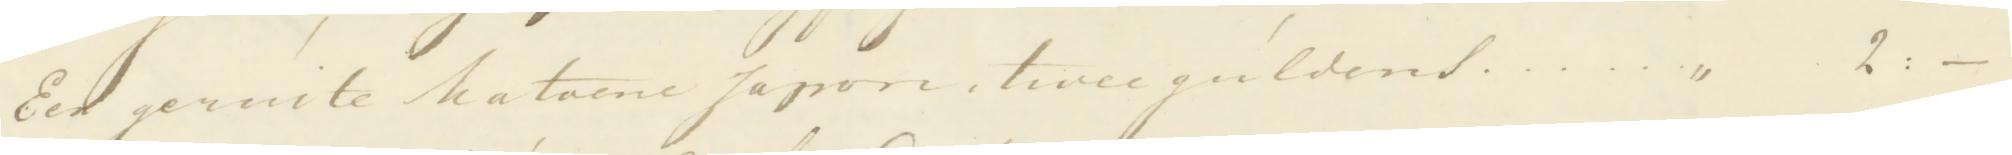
Een geruite katoene Japon, twee guldens. . . . . . . „ 2:—
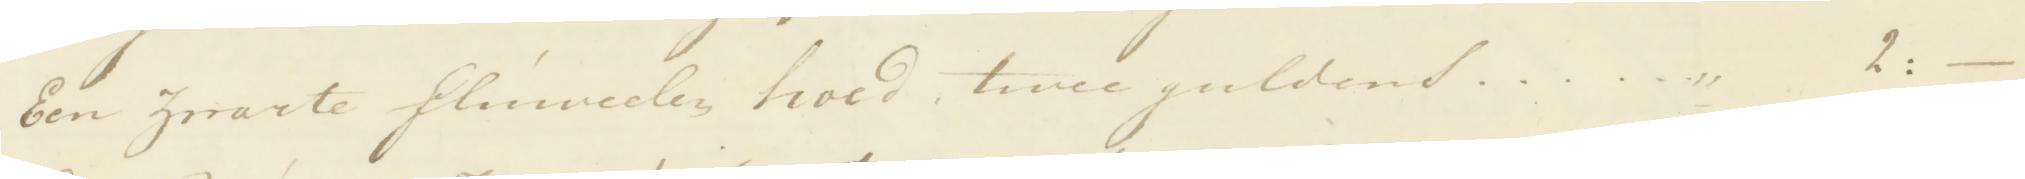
Een Zwarte fluweelen hoed, twee guldens. . . . . . . „ 2:—
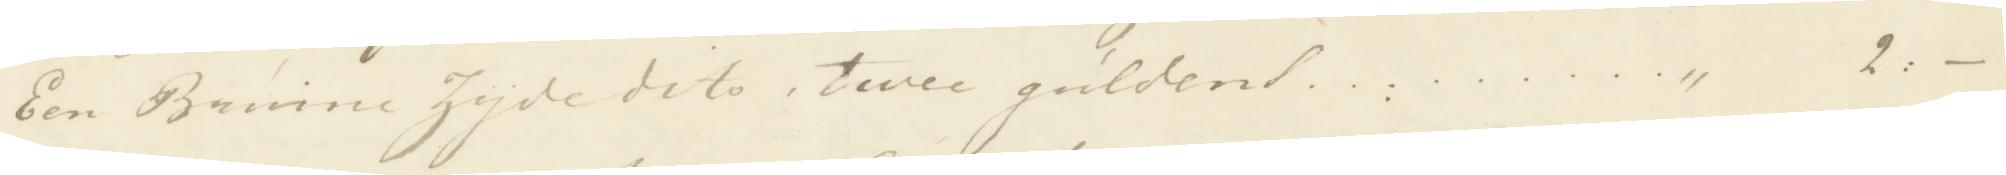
Een Bruine Zijde dito, twee guldens . . . . . . . . .. . . „ 2:—
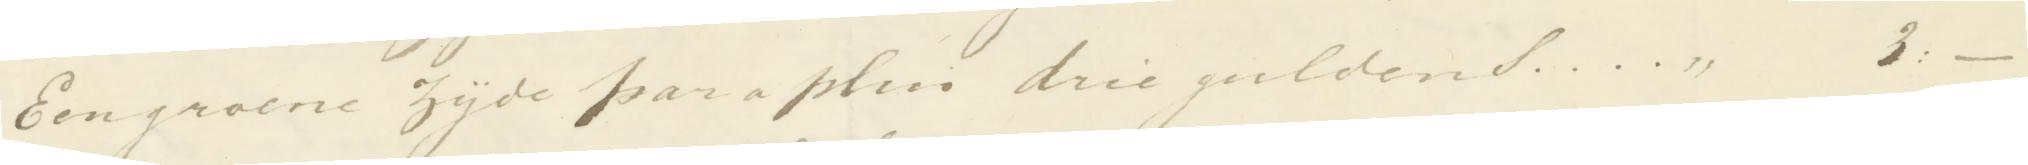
Een groene Zijde paraplui drie guldens . . . . . . . . . „ 3:—
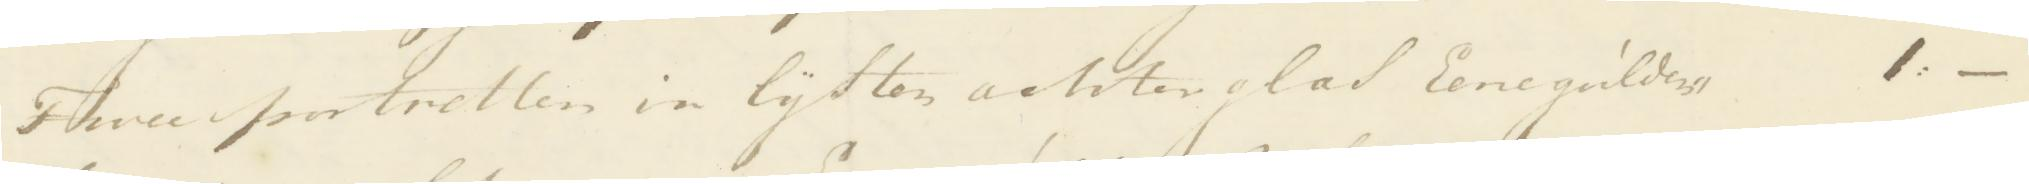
Twee portretten in lijsten achter glas Eene gulden „ 1:—
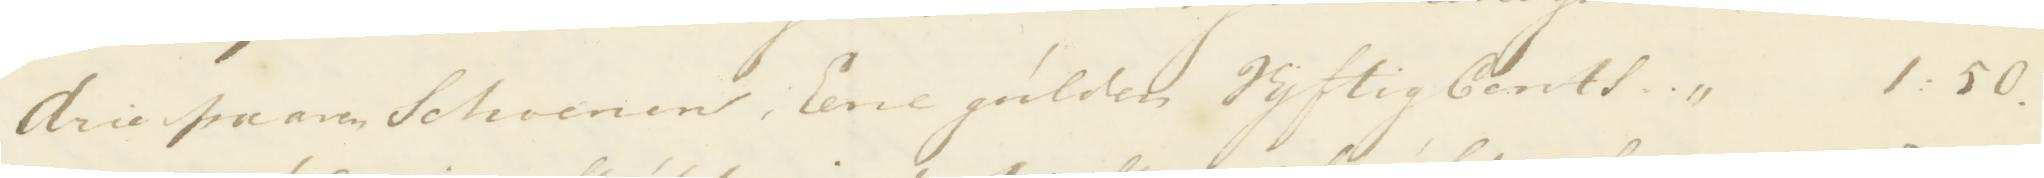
drie paaren schoenen, Eene gulden Vijftig Cents . . „ 1:50.
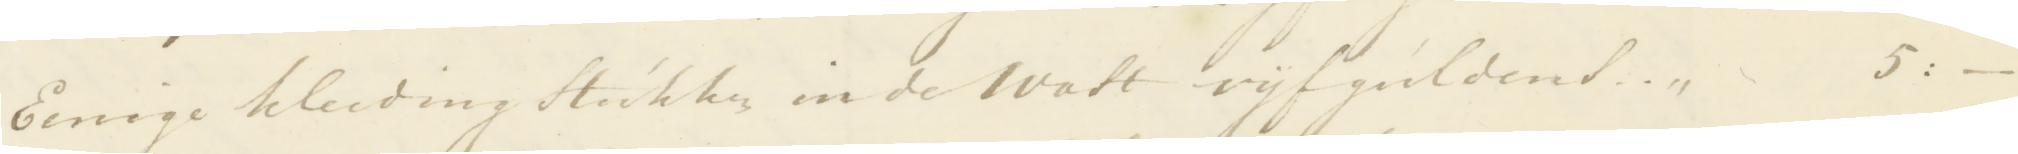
Eenige kleeding stukken in de wast vijf guldens . . . „ 5:—
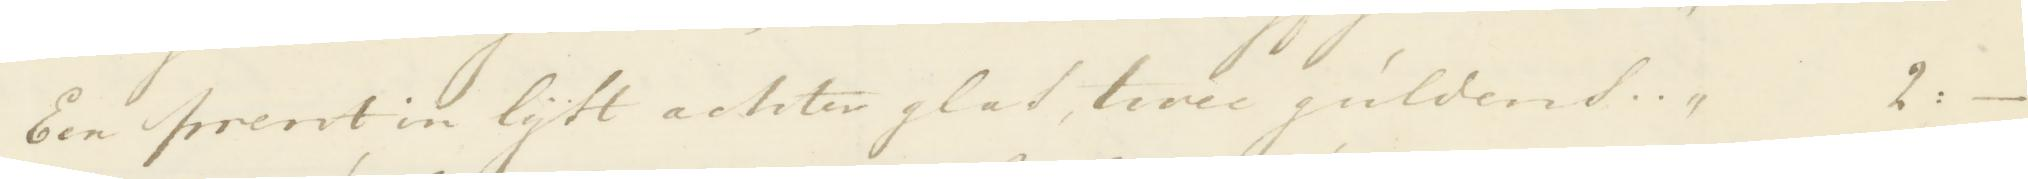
Een prent in lijst achter glas, twee guldens . .. . . . . „ 2:—
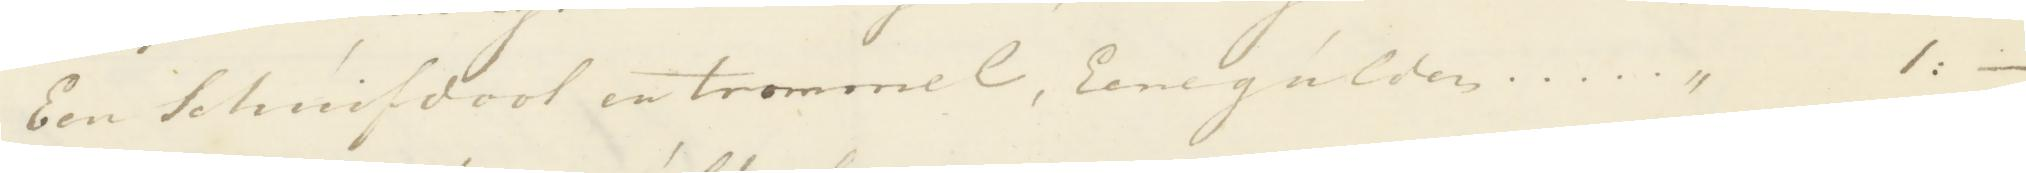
Een schuifdoos en trommel, Eene gulden . . .. . . . . „ 1:—
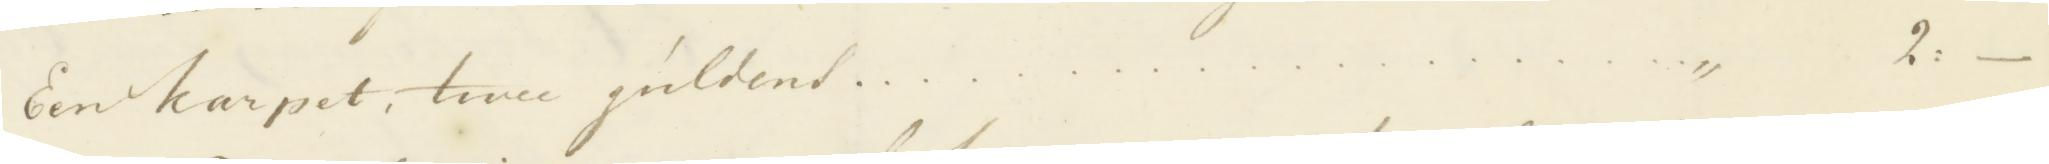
Een karpet, twee guldens. . . . . . . . . . . . . . . . . . . . . . .„ 2:—
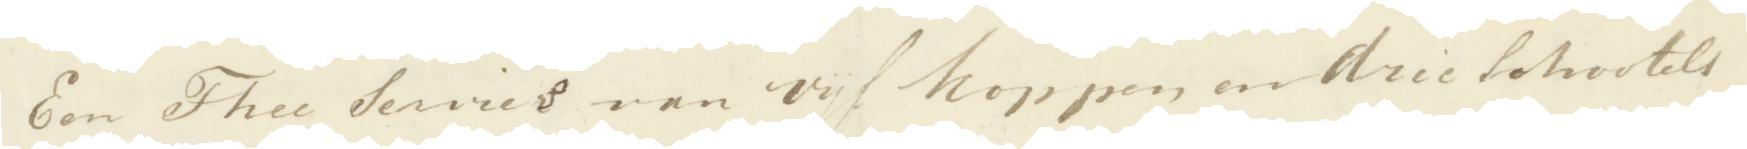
Een Thee servies van vijf koppen en drie schootels
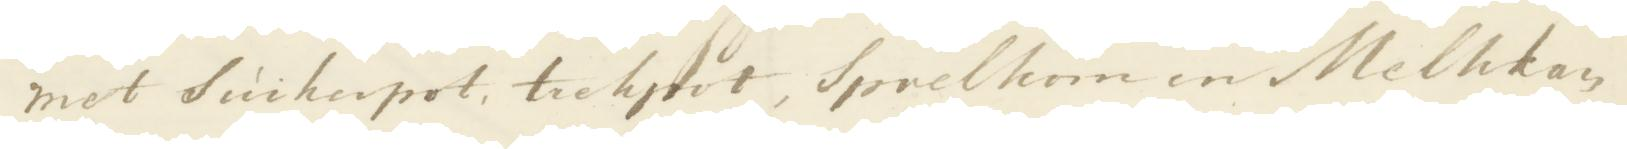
met suikerpot, trekpot, spoelkom en Melkkan
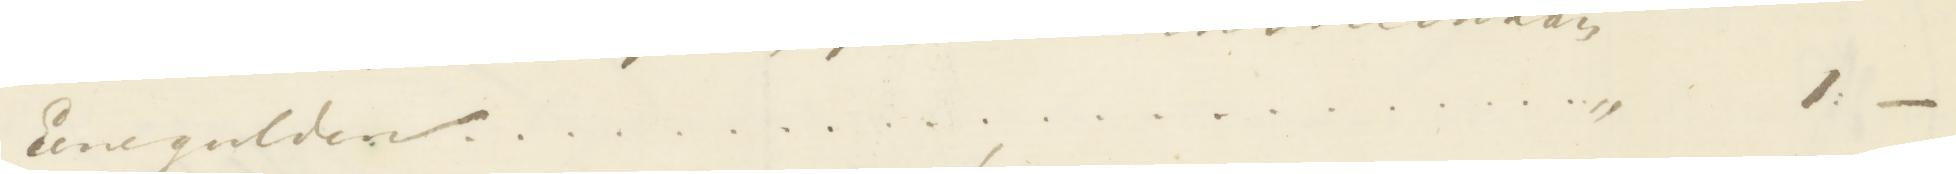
Eene gulden. . . . . . . . . . . . . . . . . . . . . . . . . . . .. . . . . .„ 1:—
